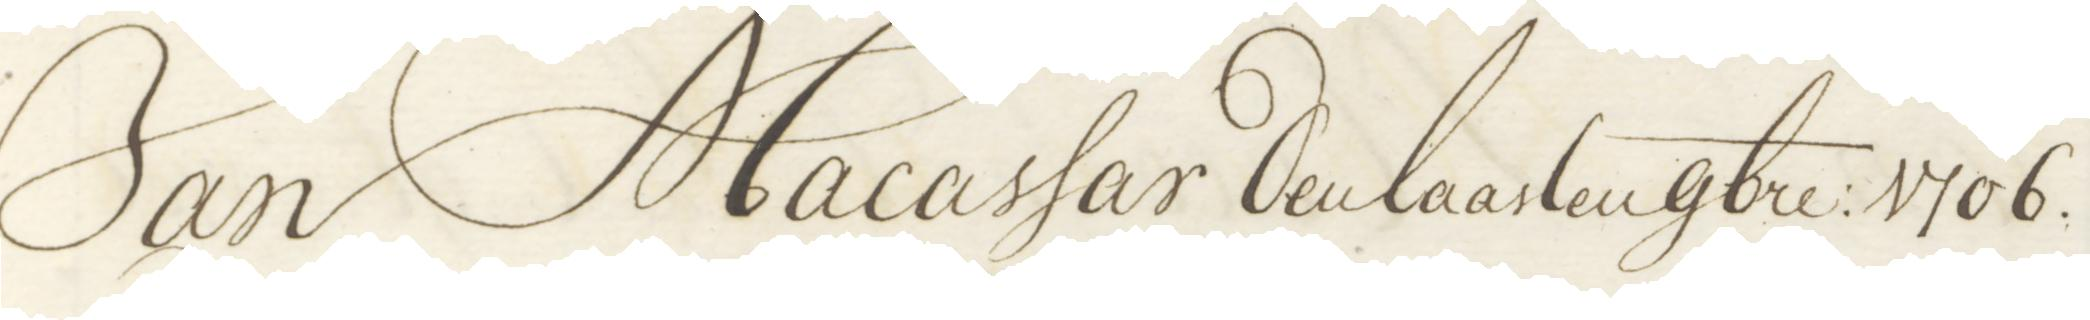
Van Macassar den laasten 9ber: 1706.
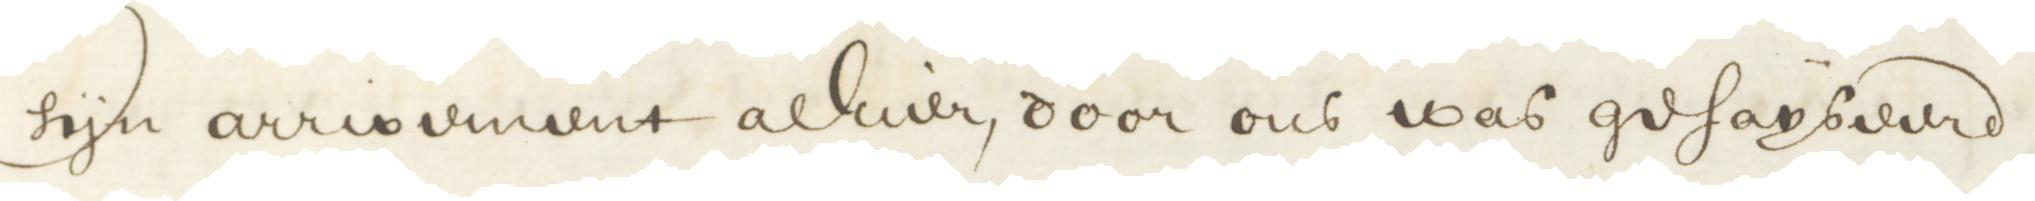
sijn arrivement alhier, door ons was gesaijseerd
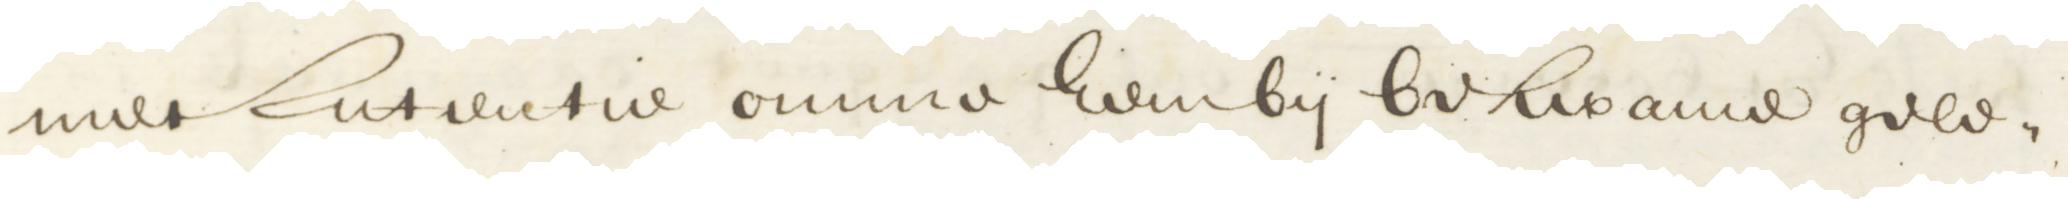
met Intentie omme hem bij bekwame gele„
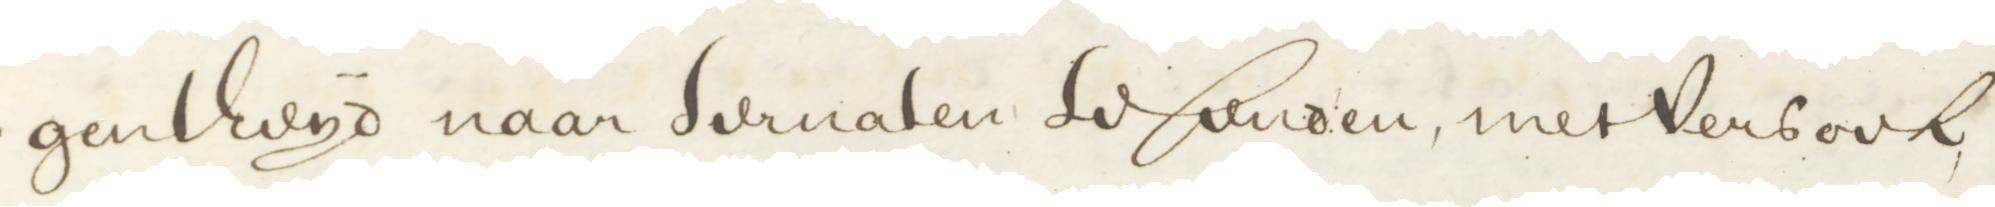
gentheijd naar ternaten te senden, met versoek
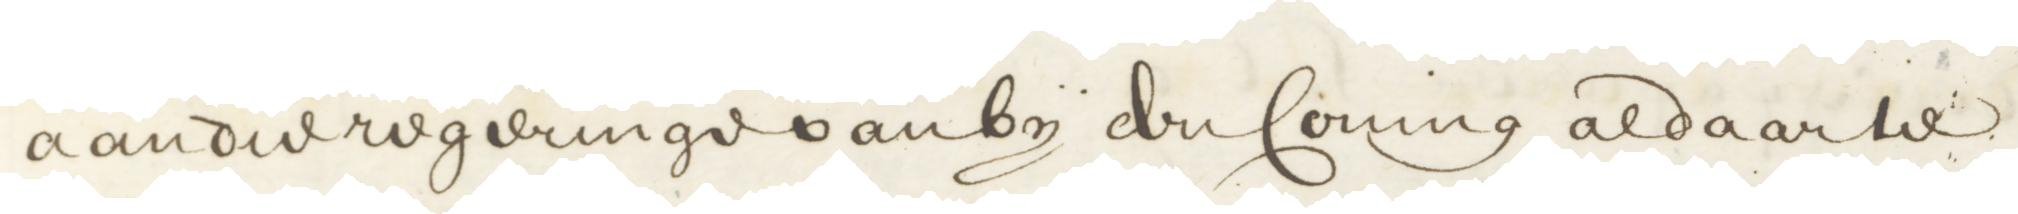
aan die regeringe van bij den Coning aldaar te
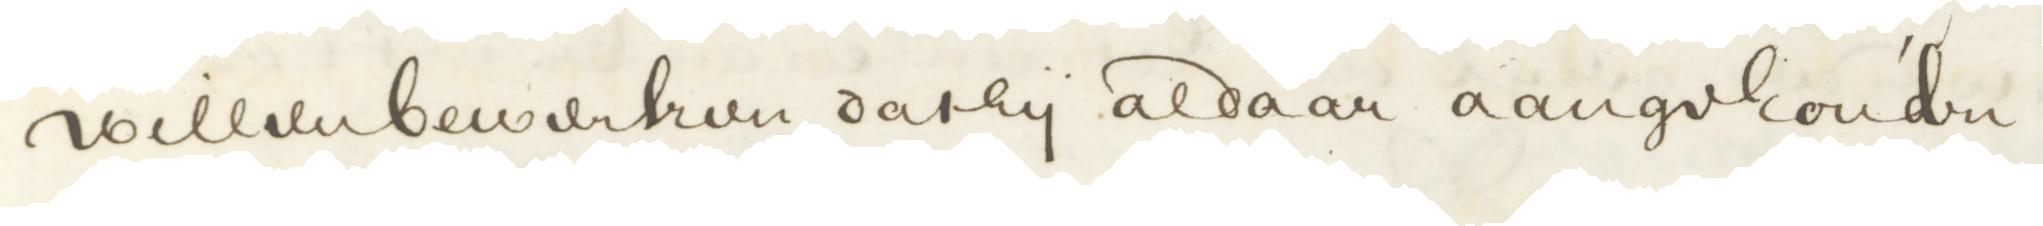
willen bewerken dat hij aldaar aangehouden
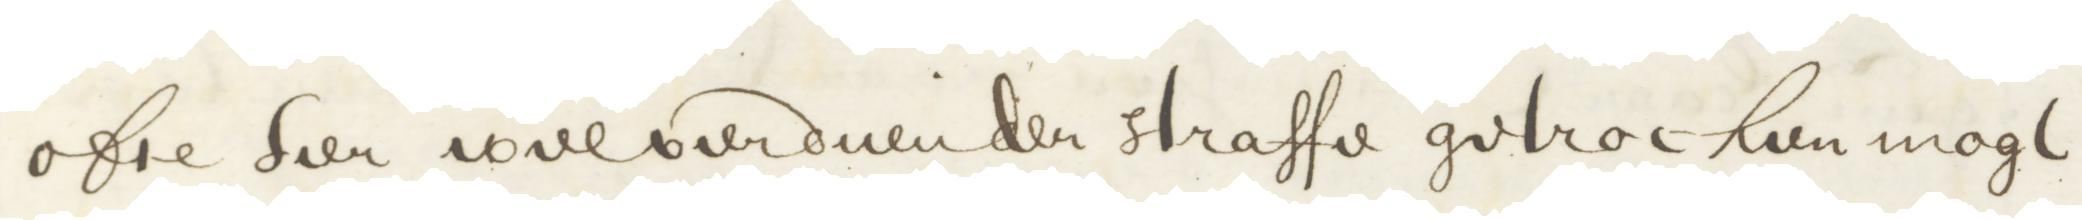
ofte ter wel verdienden straffe getrocken mogt
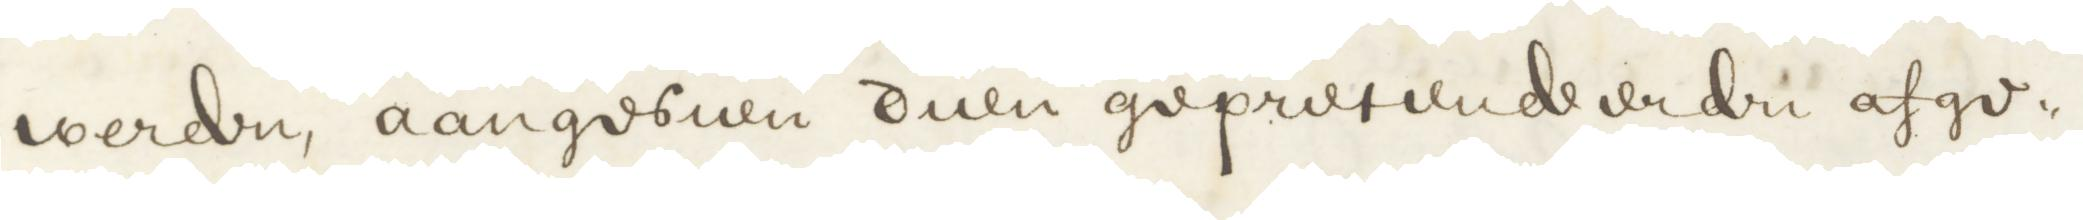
werden, aangesien dien gepretendeerden afge„
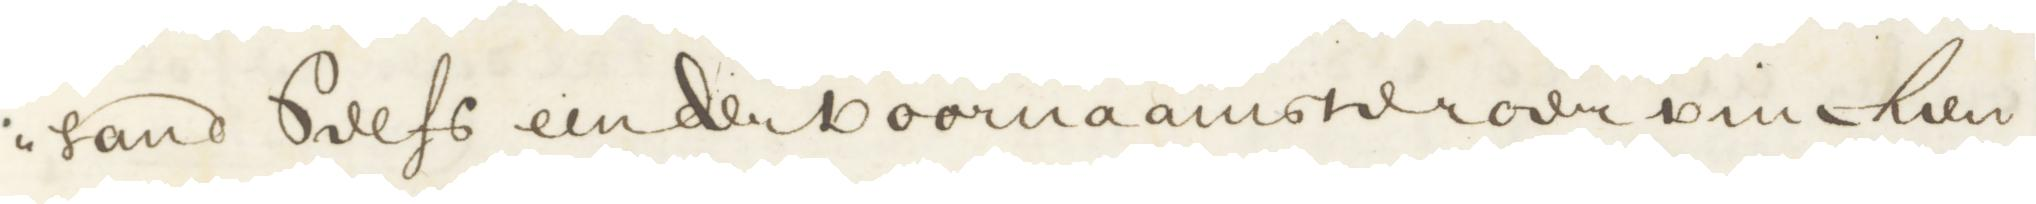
„sand selfs een der voornaamste roer vincken
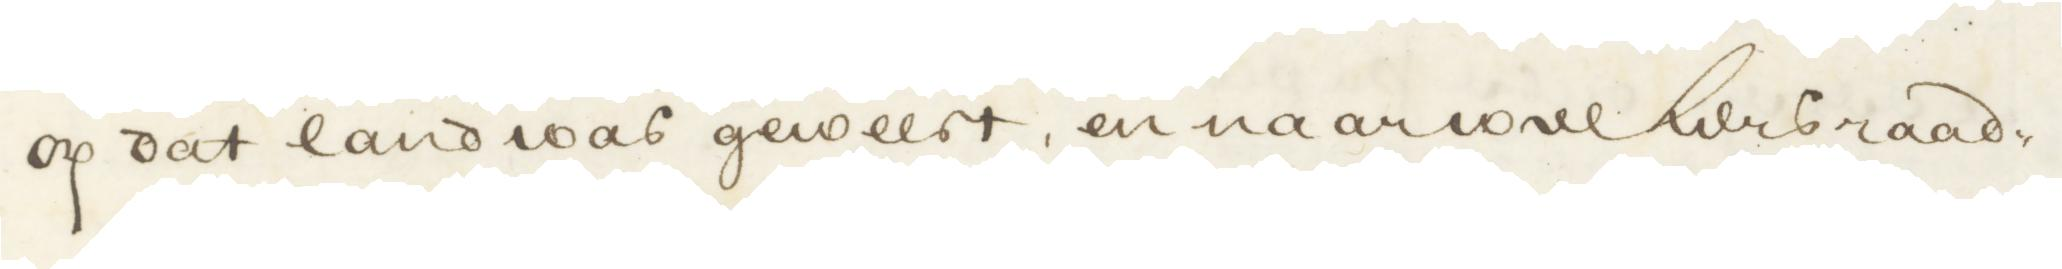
op dat land was geweest, en naar welkers raad„
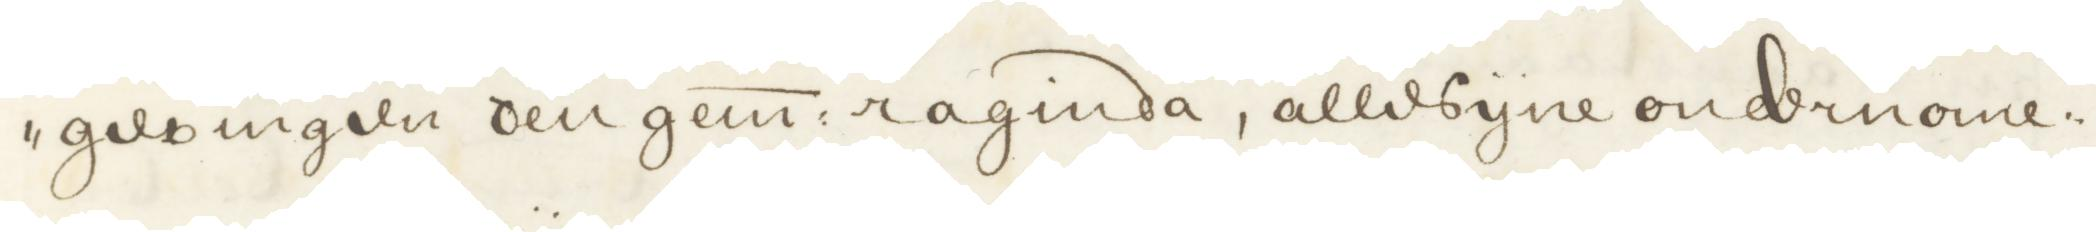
„gevingen den gem: raginda, allesijne ondernome„
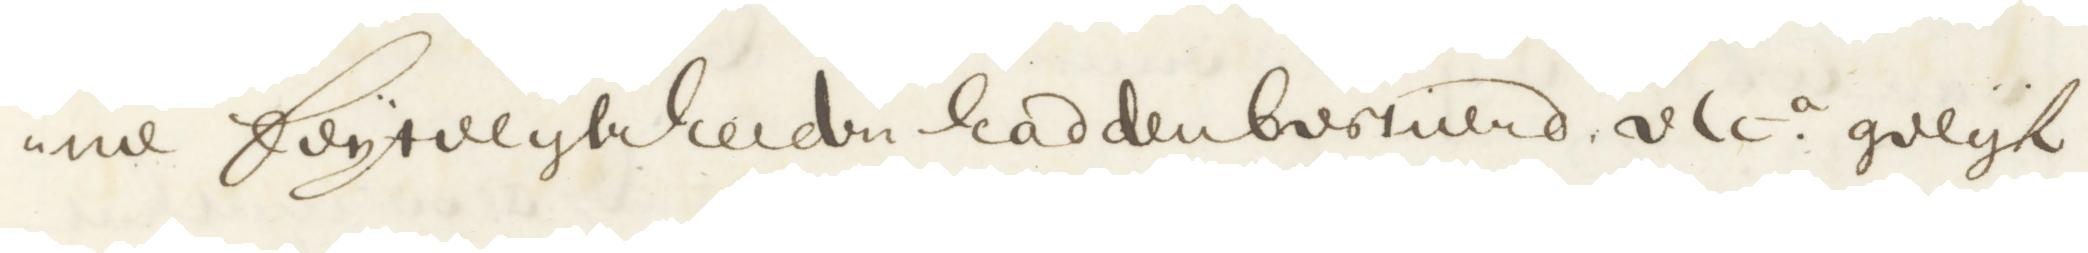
„ne feijtelijkheeden hadden bestierd, etc.a gelijk
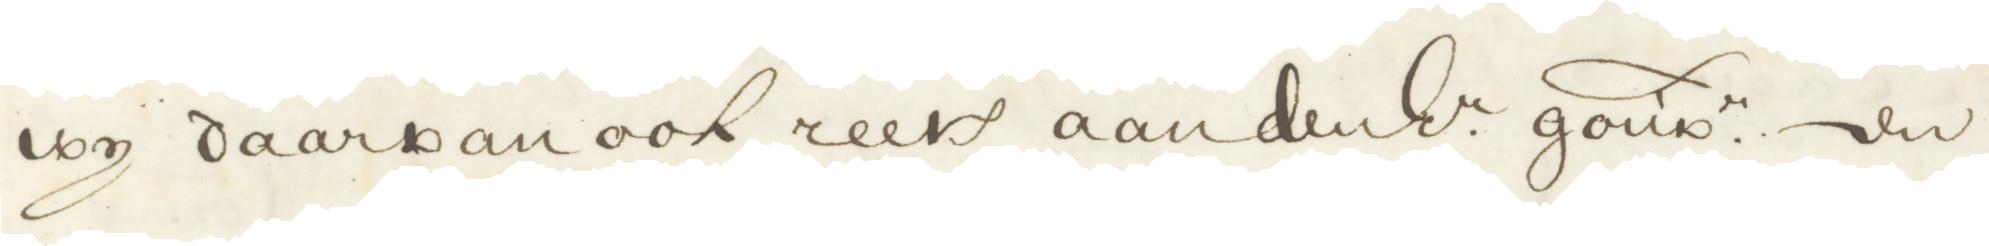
wij daarvan ook reets aan den h.r gouv.r en
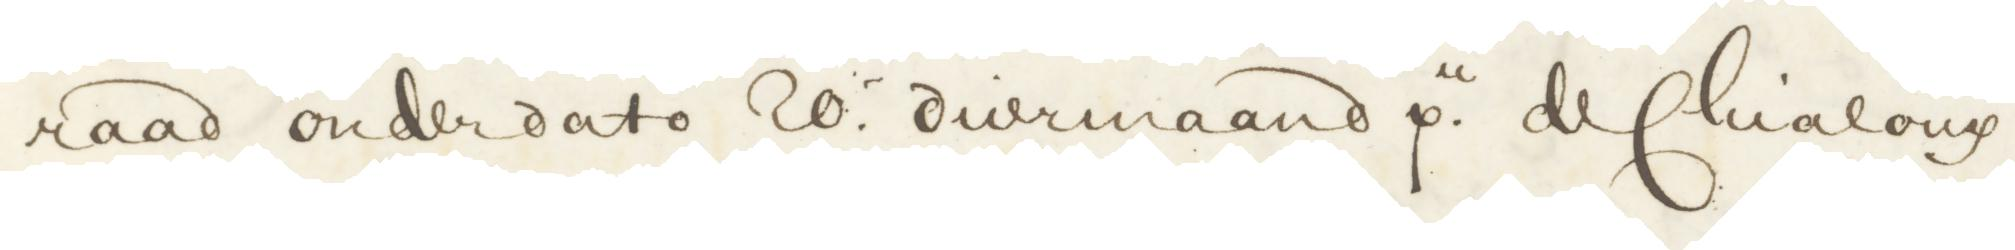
raad onder dato 20.' diermaand p.r de Chialoup
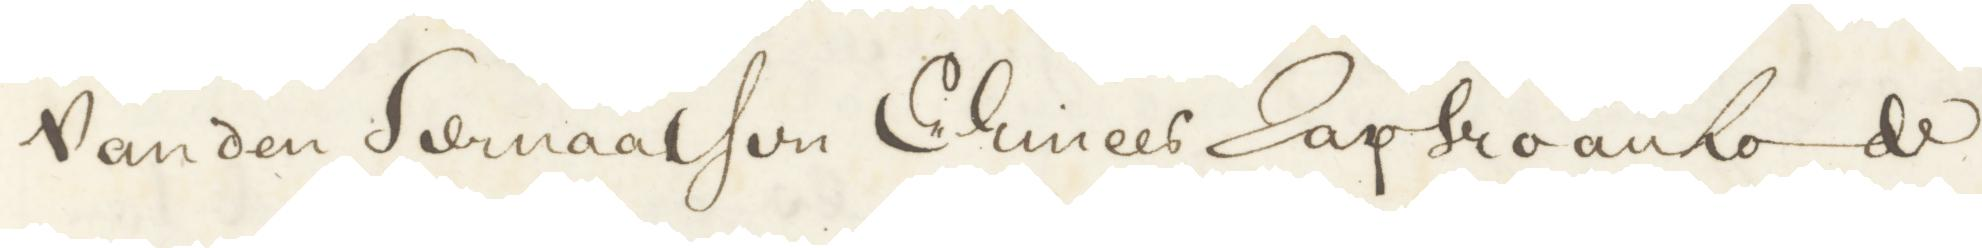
van den Ternaatsen Chinees Iapkoanko de
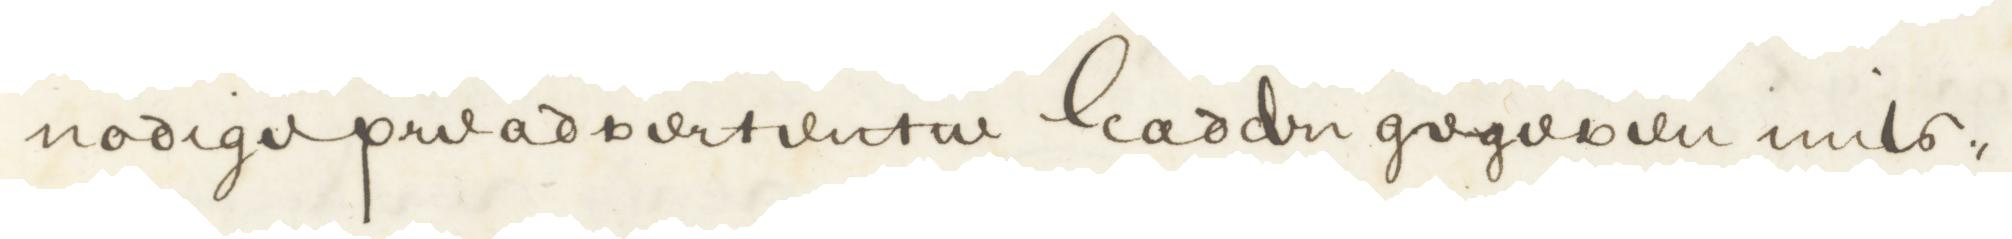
nodige preadvertentie hadden gegeven mits„
